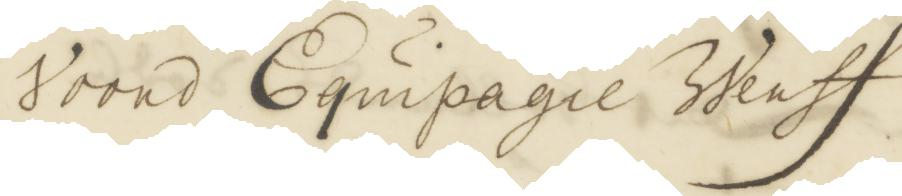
voord' Equipagie Werff
